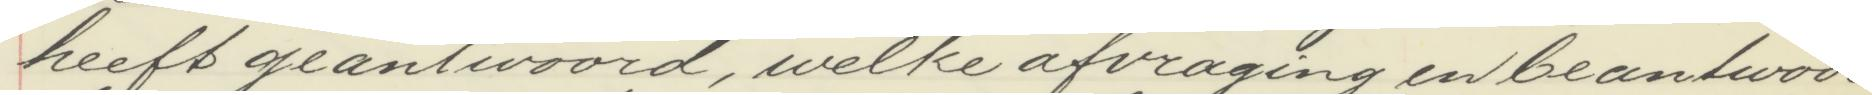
heeft geantwoord, welke afvraging en beantwoor
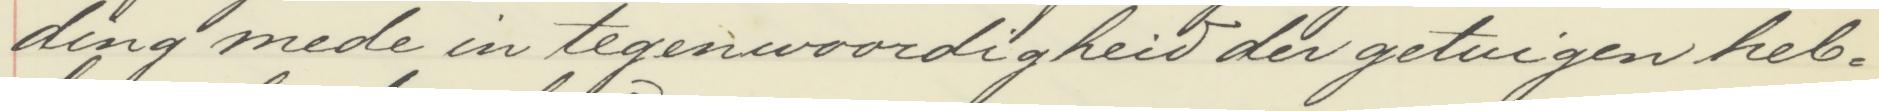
ding mede in tegenwoordigheid der getuigen heb=
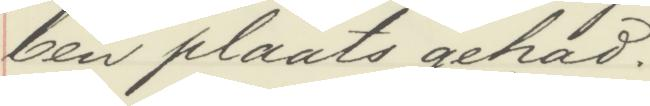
ben plaats gehad.
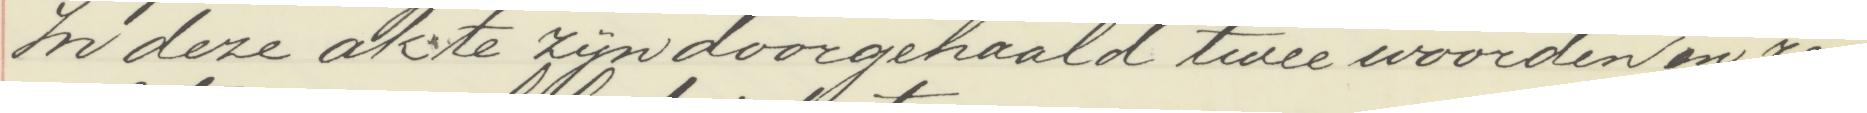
In deze akte zijn doorgehaald twee woorden en re=
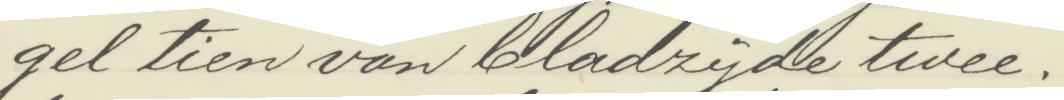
gel tien van bladzijde twee.
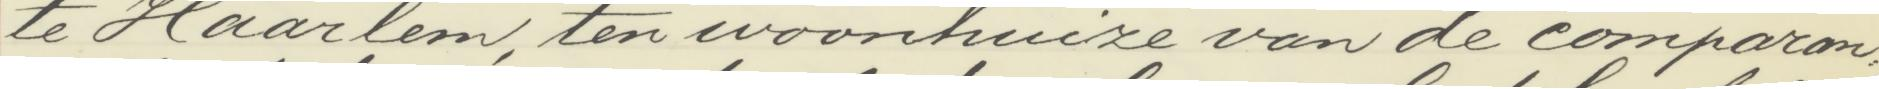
te Haarlem, ten woonhuize van de comparan
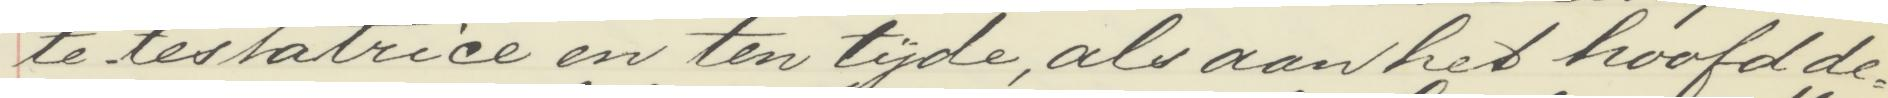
te testatrice en ten tijde, als aan het hoofd de
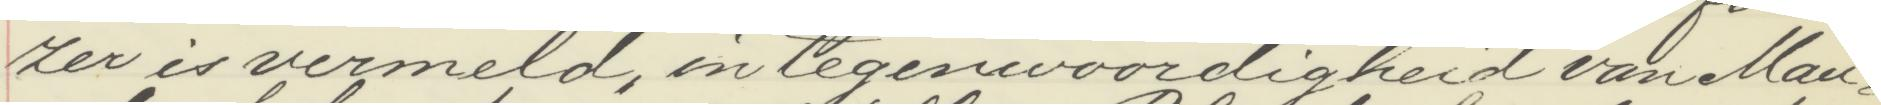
zer is vermeld, in tegenwoordigheid van Mau=
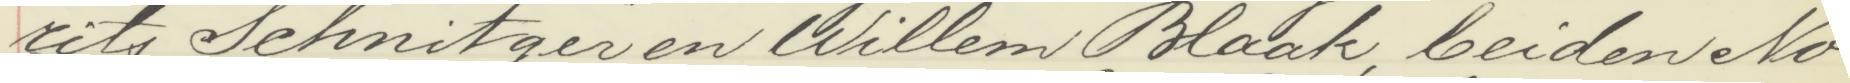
rits Schnitger en Willem Blaak, beiden No
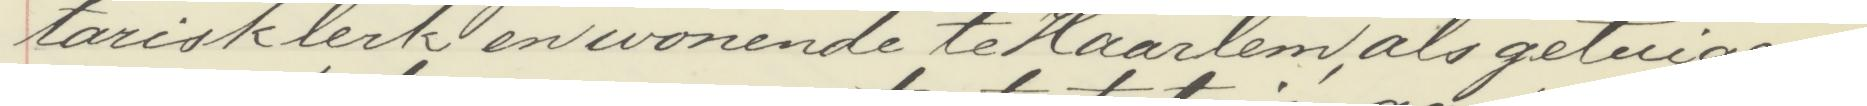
tarisklerk en wonende te Haarlem, als getuigen
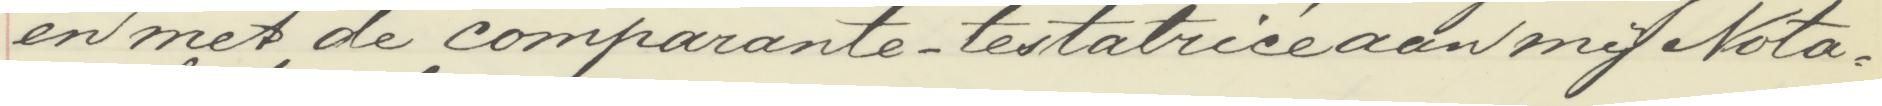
en met de comparante-testatrice aan mij Nota„
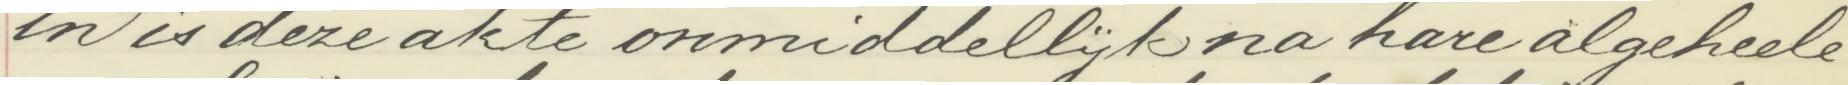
En is deze akte onmiddellijk na hare algeheele
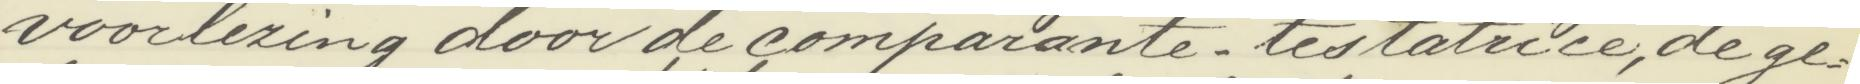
voorlezing door de comparante- testatrice, de ge=
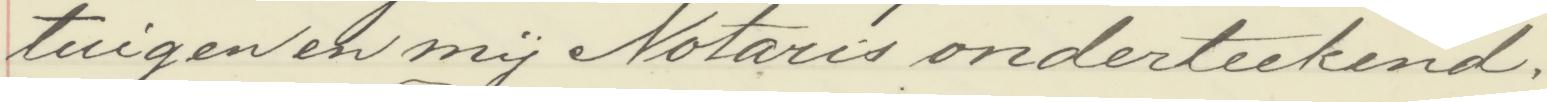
tuigen en mij Notaris onderteekend.
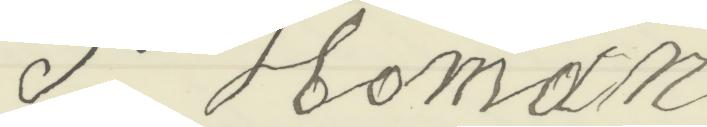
P Homan
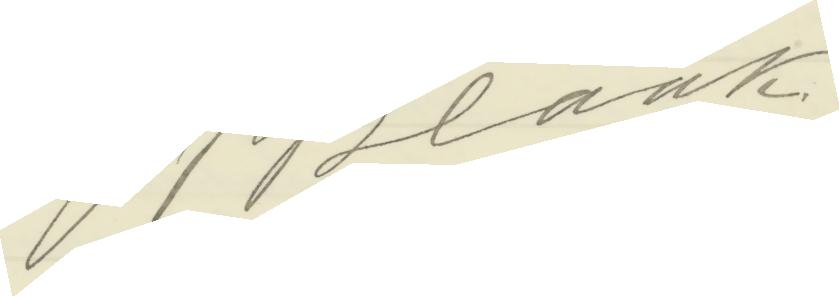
JWBlaak
